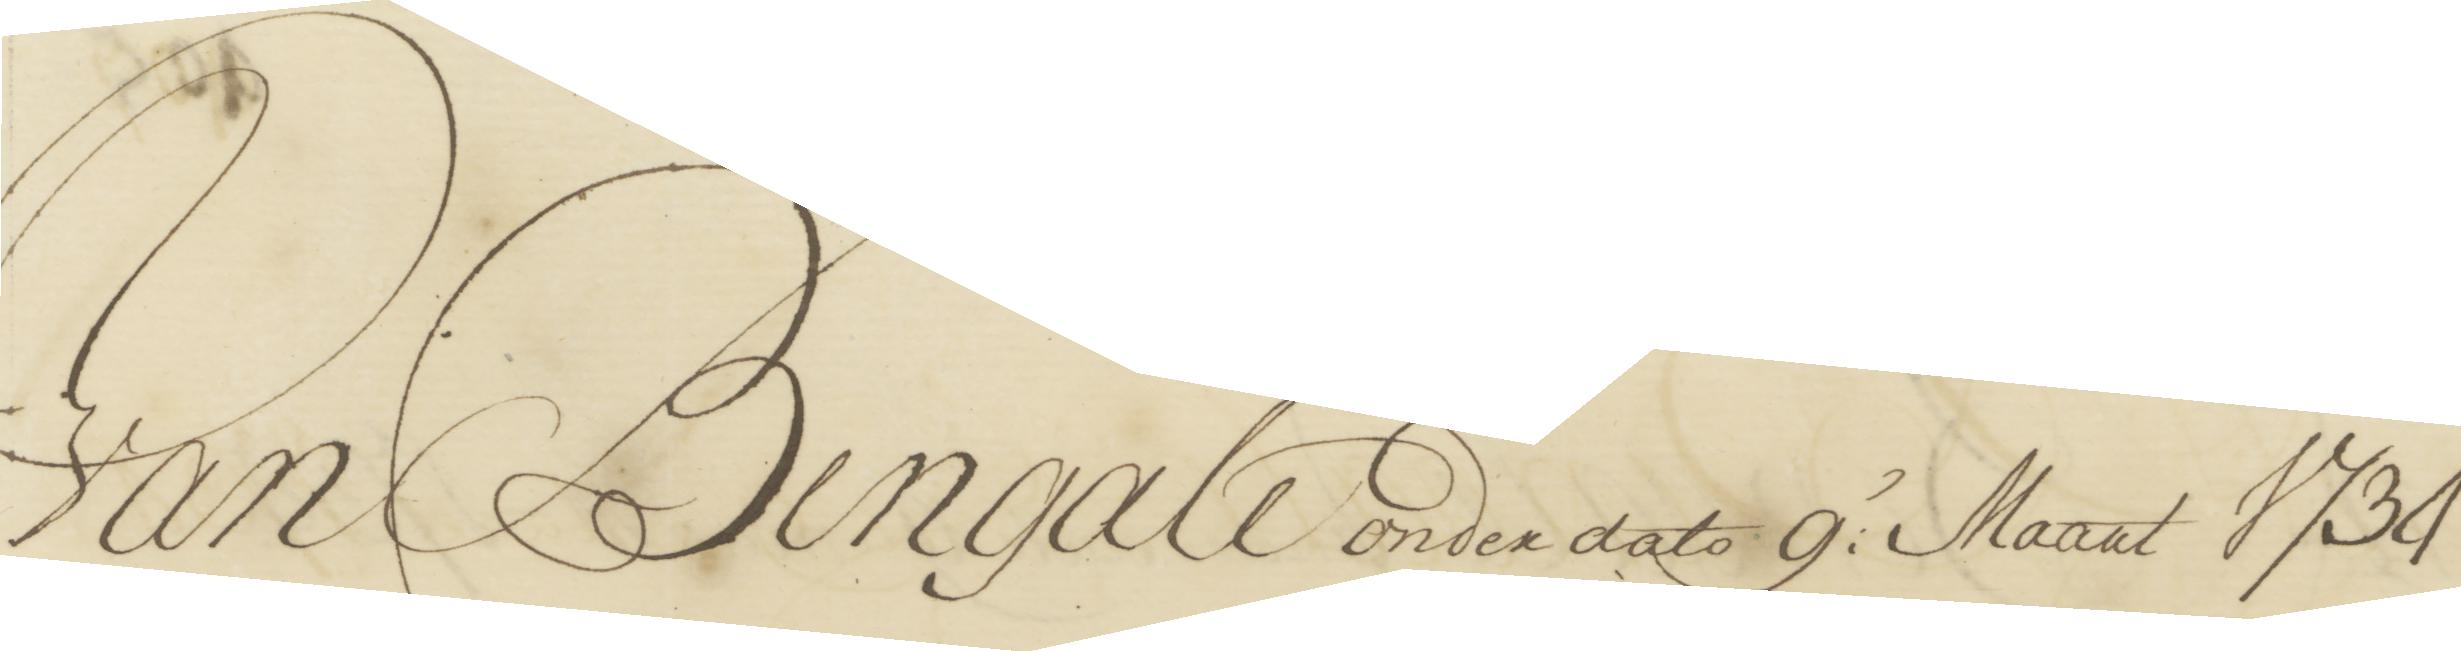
Van Bengale onder dato 9:' Maart 1734
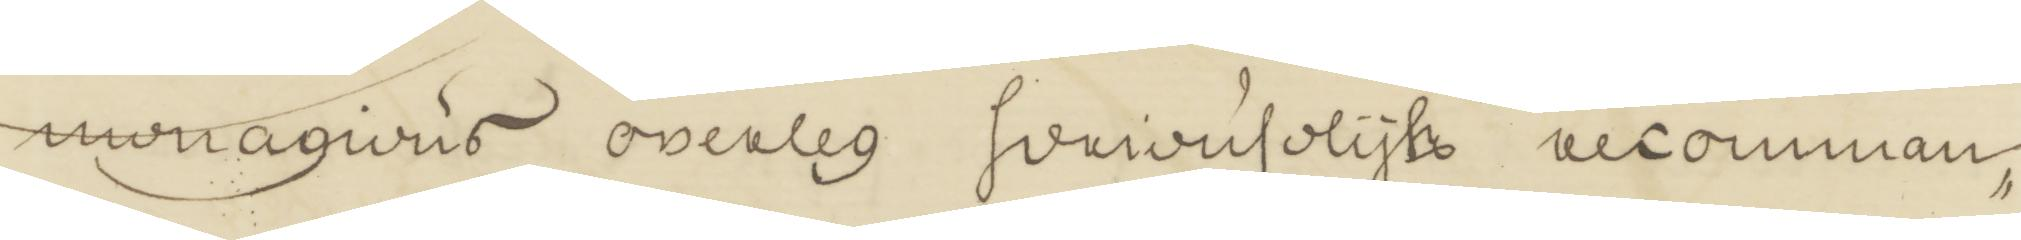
menagieus overleg serieuselijk recomman„
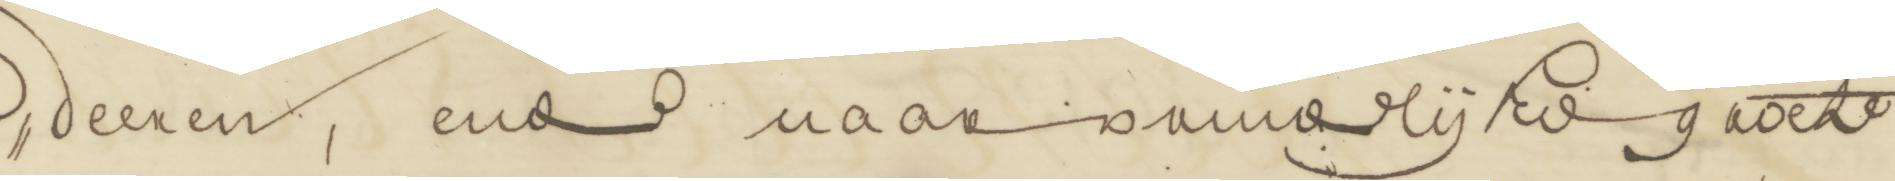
„deeren, ende naar vrindelijke groete
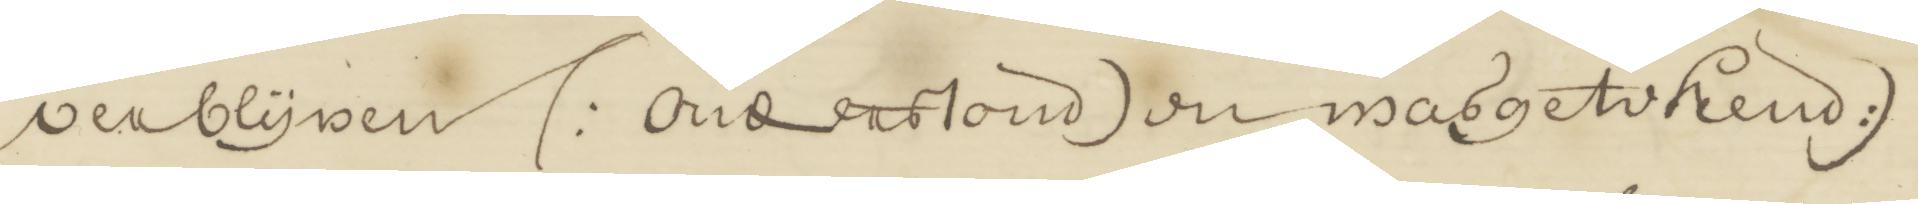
verblijven (:onderstond) en was getekend:)
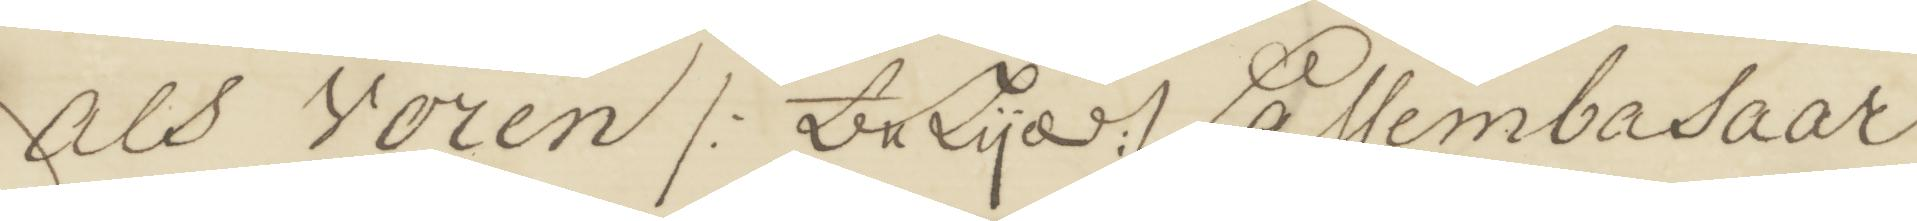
als voren /:ter zijde:/ Cassembasaar
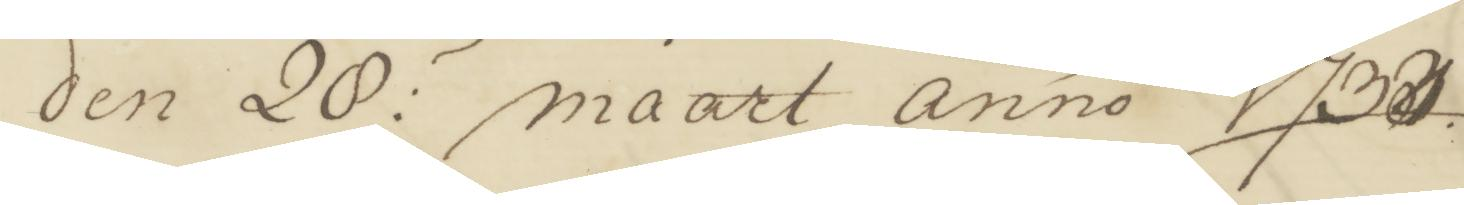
den 28:' maart anno 1734.
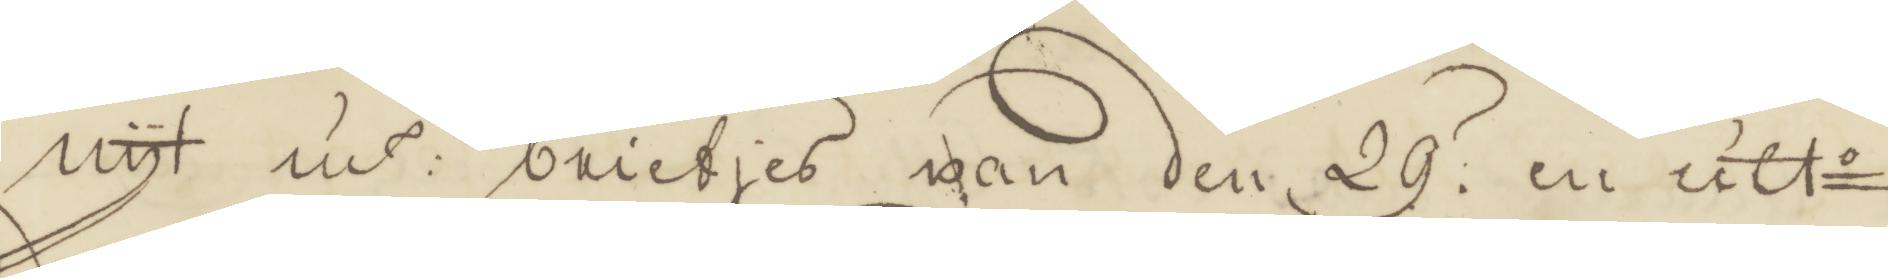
uijt uE: briefjes van den 29:' en ult=o
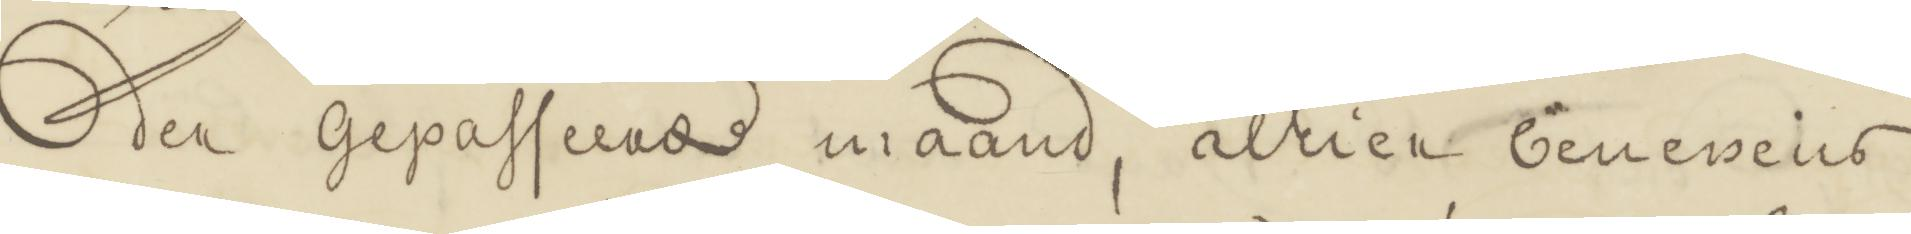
der gepasseerde maand, alhier benevens
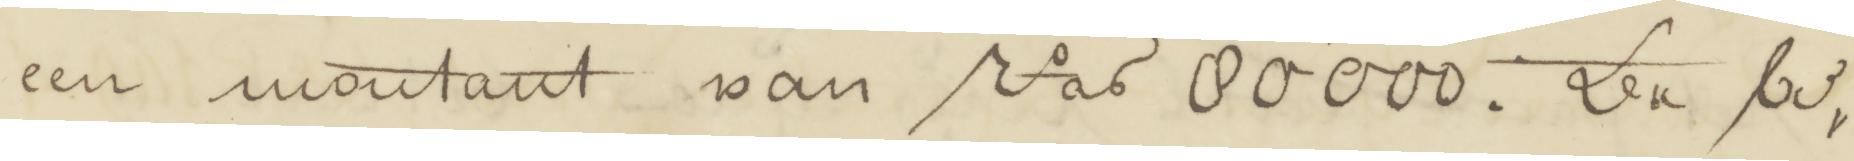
een montant van ro/as 80'000. ter be„
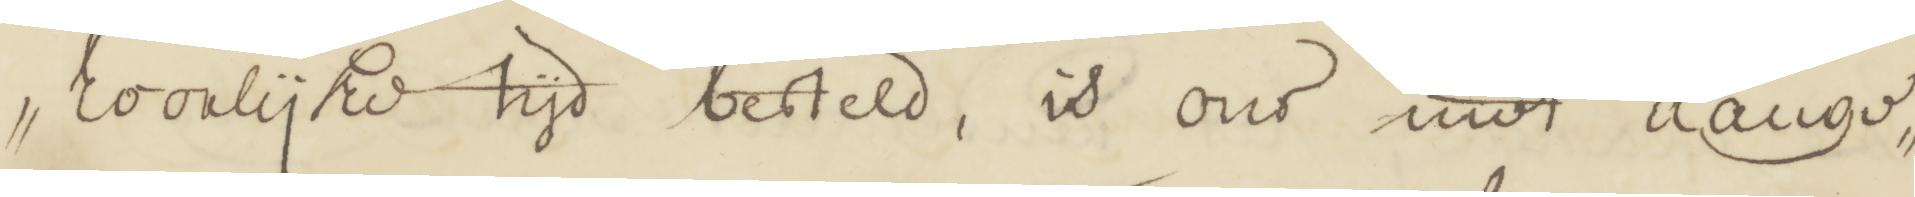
„hoorlijke tijd besteld, is ons met aange„
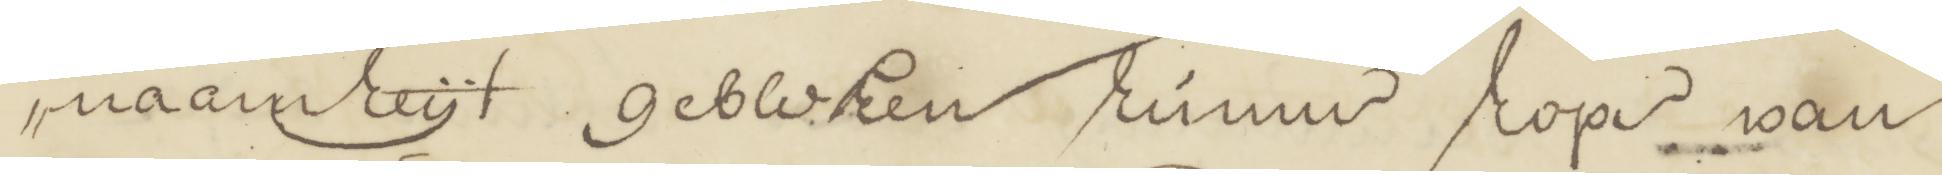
„naamheijt gebleken hunne hope van
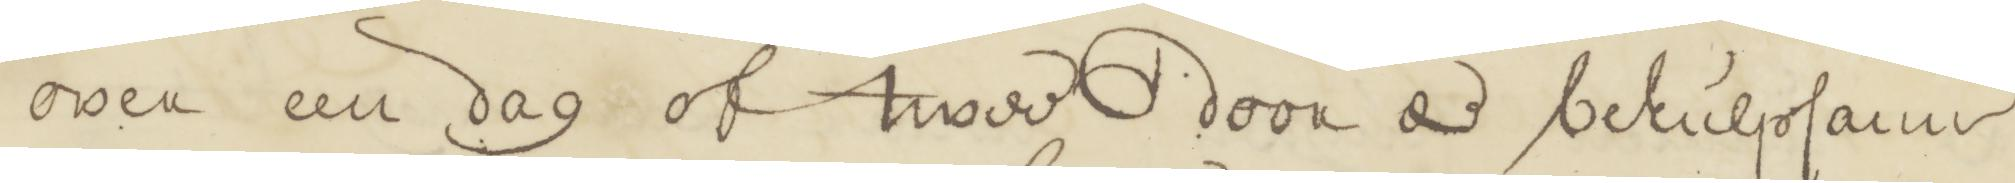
over een dag of twee door de behulpsame
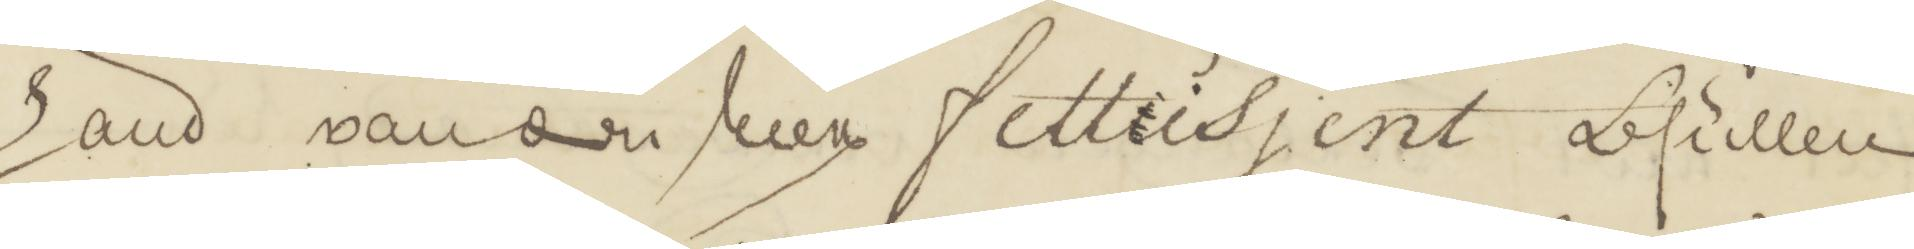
hand van den heer fettisjent te sullen
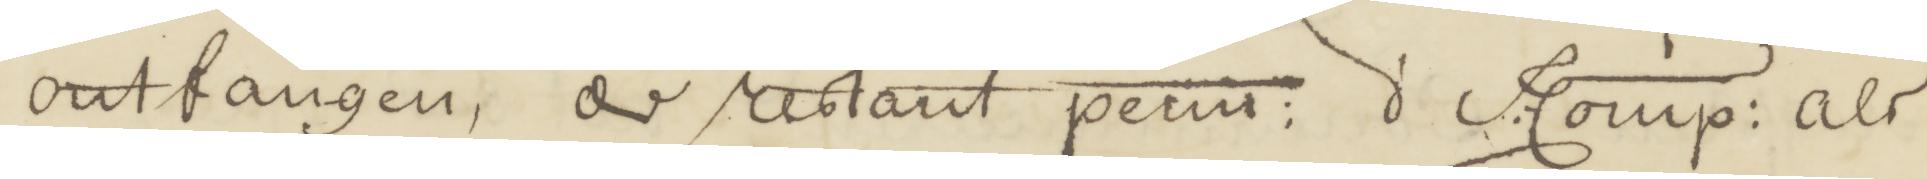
ontfangen, de restant penn: d’ S:Comp: als
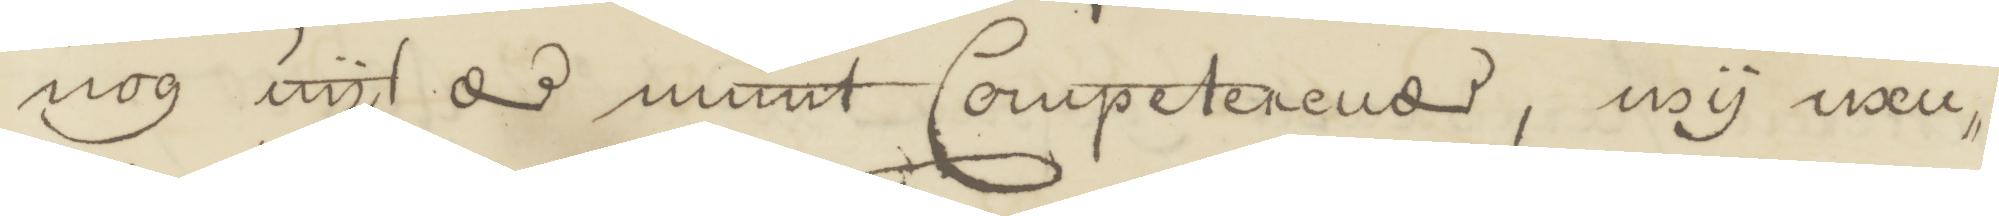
nog uijt de munt Competerende, wij wen„
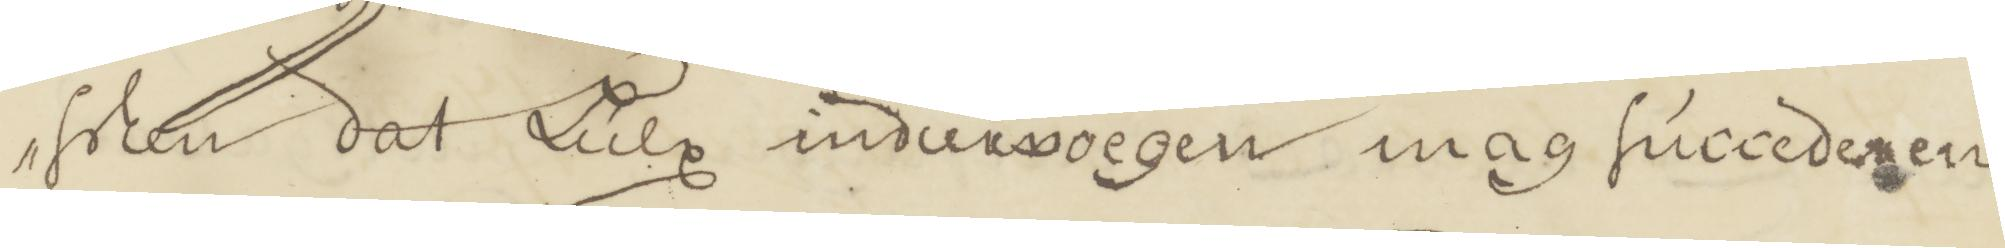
„schen dat zulx indiervoegen mag succederen
